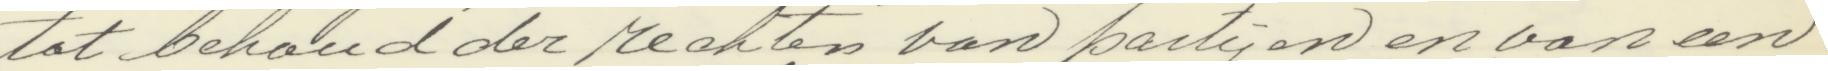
tot behoud der rechten van partijen en van een
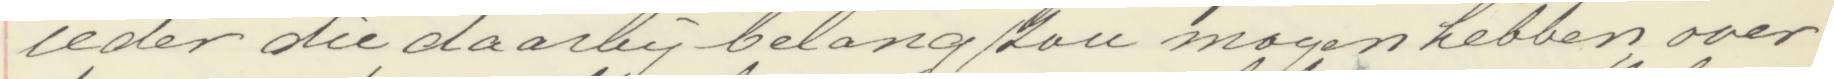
ieder die daarbij belang zou mogen hebben over
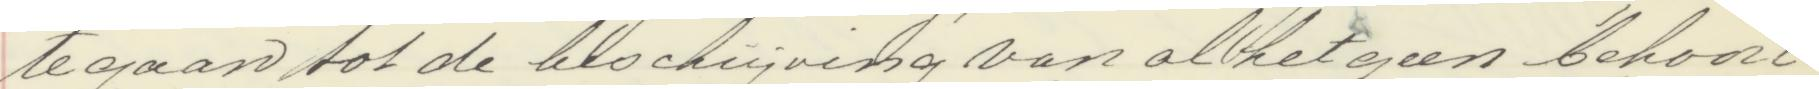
te gaan tot de beschrijving van al hetgeen behoort
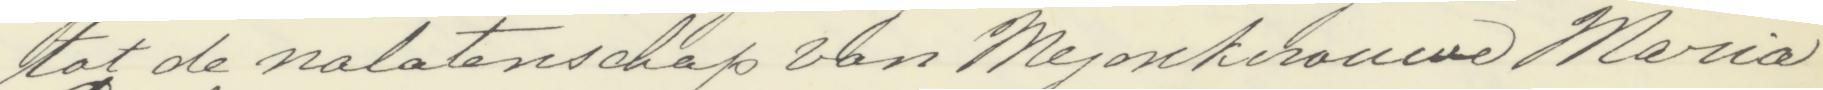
tot de nalatenschap van Mejonkvrouwe Maria
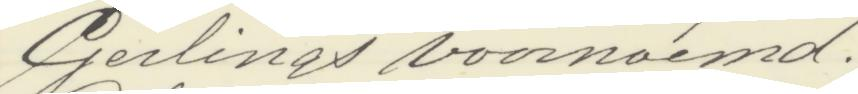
Gerlings voornoemd.
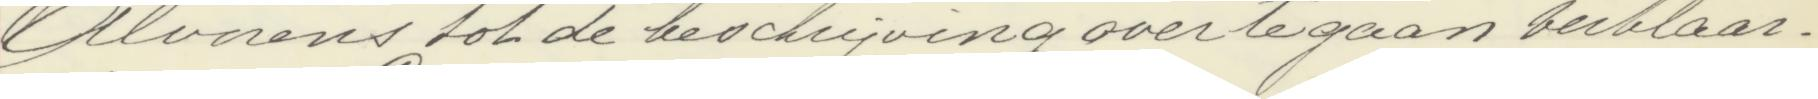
Alvorens tot de beschrijving over te gaan verklaar-
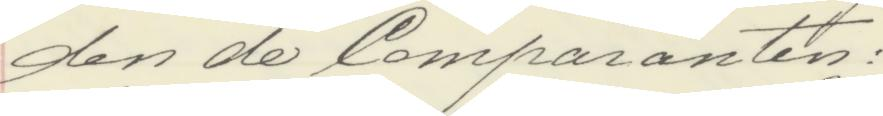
den de Comparanten:
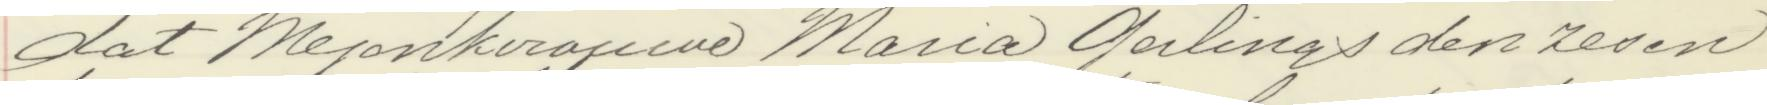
dat Mejonkvrouwe Maria Gerlings den zes en
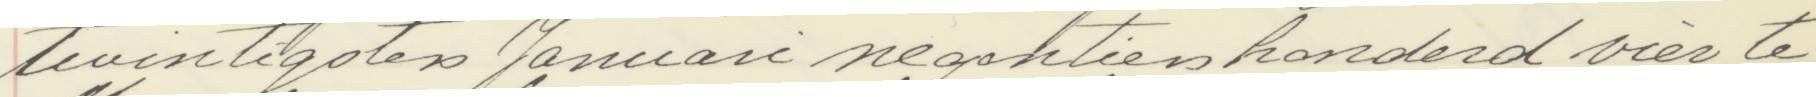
twintigsten Januari negentien honderd vier te
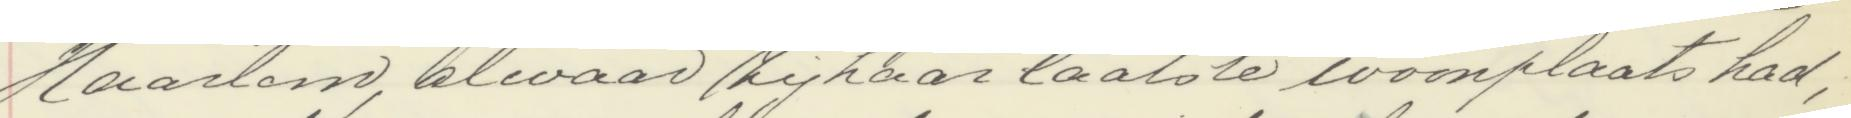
Haarlem, alwaar zij haar laatste woonplaats had,
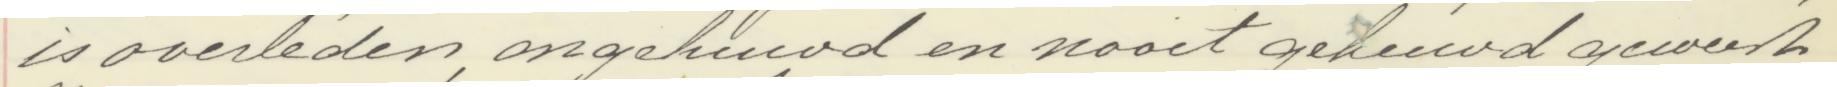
is overleden, ongehuwd en nooit gehuwd geweest
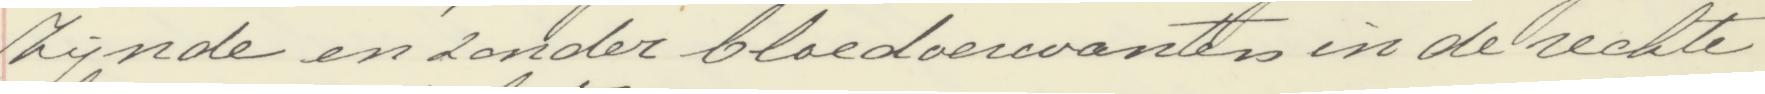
zijnde en zonder bloedverwanten in de rechte
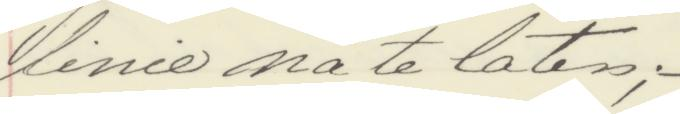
linie na te laten;
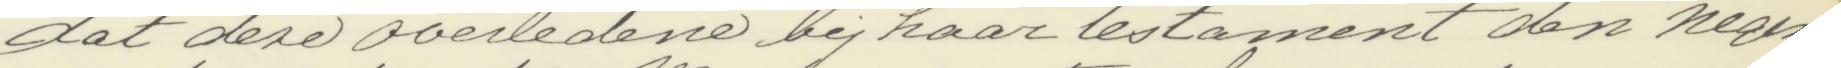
dat deze overledene bij haar testament den negen
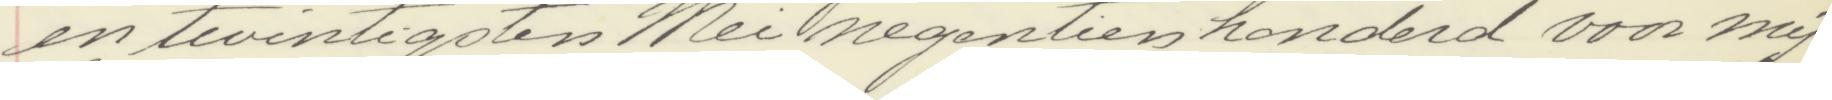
en twintigsten Mei negentien honderd voor mij
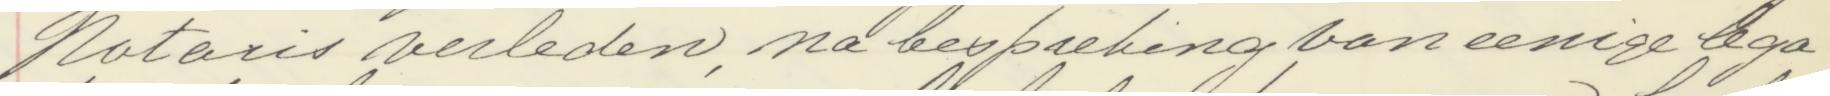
Notaris verleden, na bespreking van eenige lega
